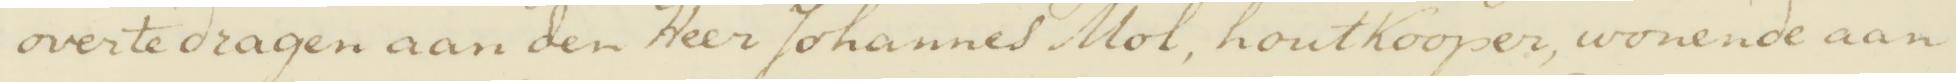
over te dragen aan den Heer Johannes Mol, houtkooper, wonende aan
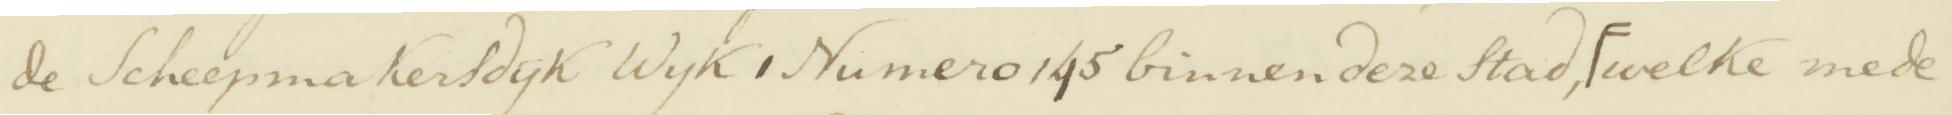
de scheepmakersdijk Wyk 1 Numero 145 binnen deze stad, F welke mede
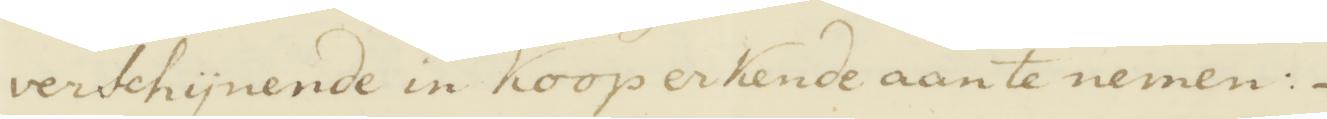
verschijnende in koop erkende aan te nemen:
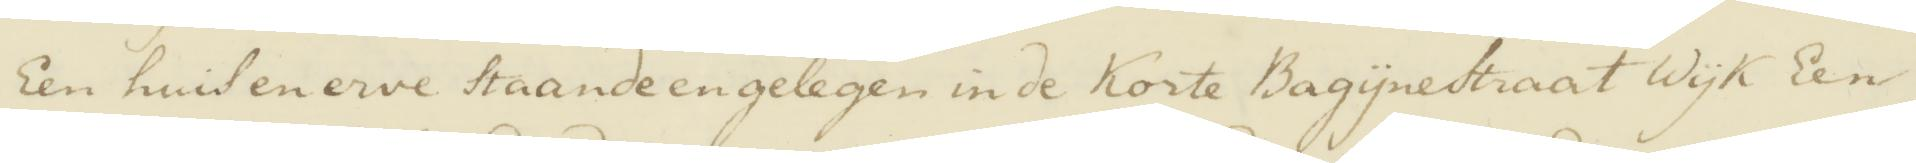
Een huis en erve staande en gelegen in de Korte Bagijnestraat Wijk Een
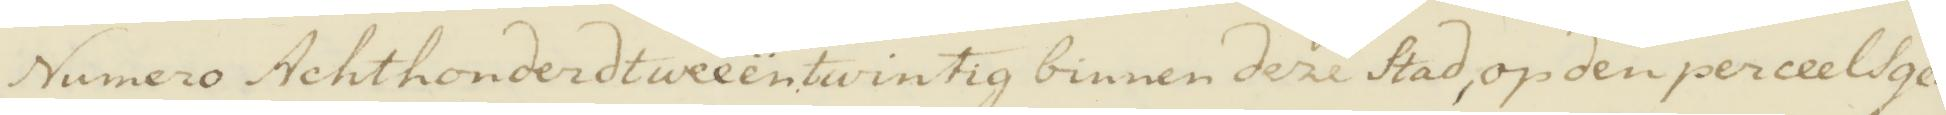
Numero Achthonderd tweeëntwintig binnen deze stad, op den perceels ge-
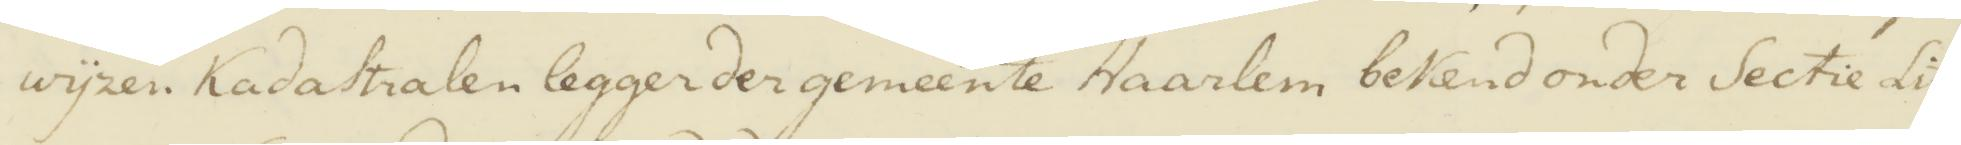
wijzen kadastralen legger der gemeente Haarlem bekend onder sectie Lit-
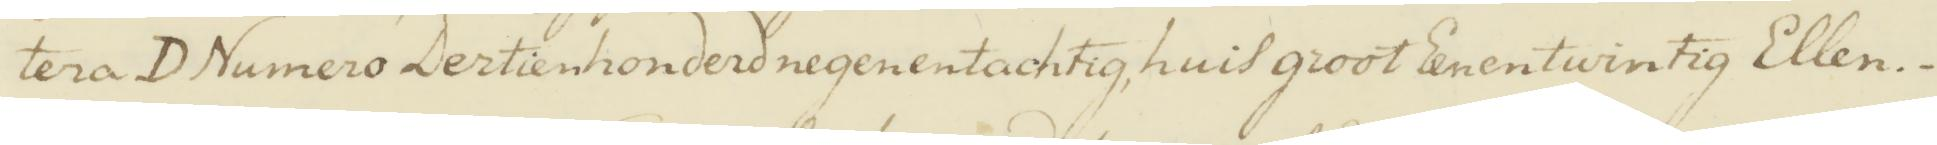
tera D Numero Dertienhonderd negenentachtig, huis groot Eenentwintig Ellen.
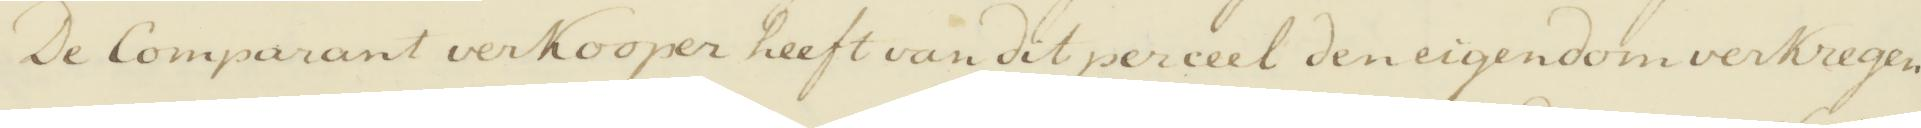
De Comparant verkooper heeft van dit perceel den eigendom verkregen
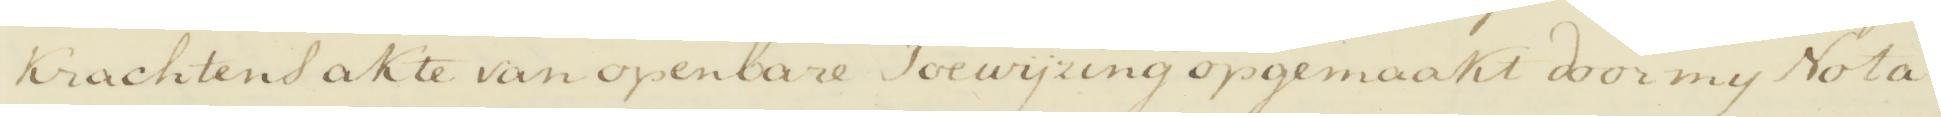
krachtens akte van openbare Toewijzing opgemaakt door my Nota-
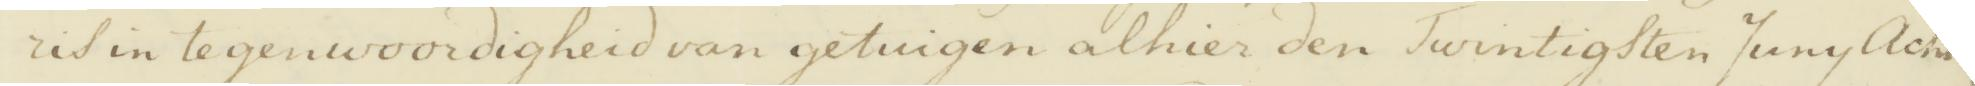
ris in tegenwoordigheid van getuigen alhier den Twintigsten Juny Acht
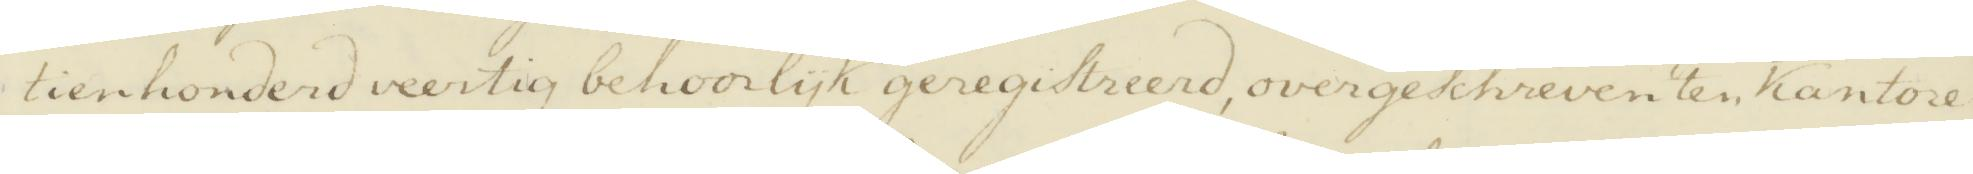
tien honderd veertig behoorlijk geregistreerd, overgeschreven ten Kantore
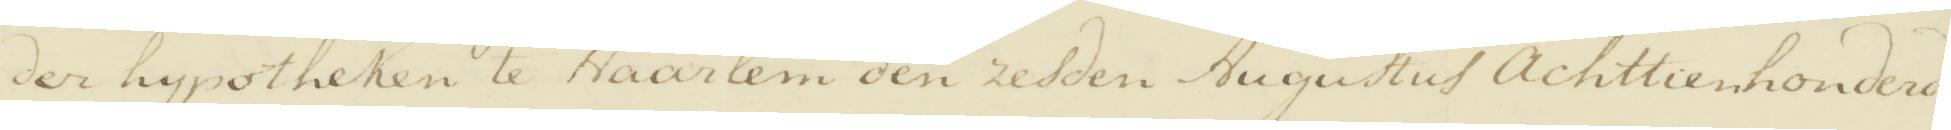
der hypotheken te Haarlem den zesden Augustus Achttienhonderd
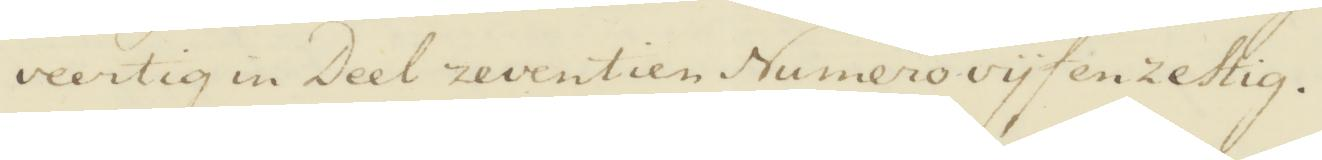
veertig in Deel zeventien Numero vijf en zestig.
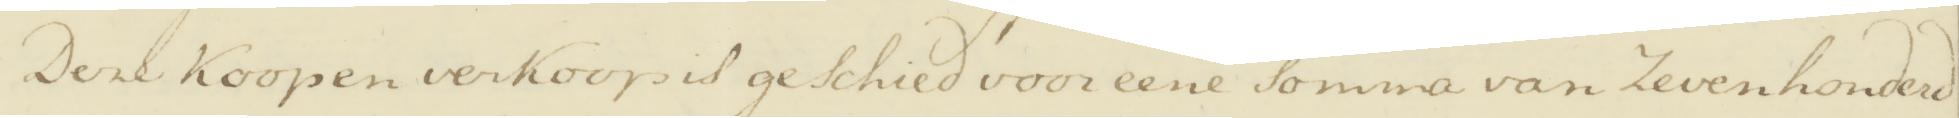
Deze Koop en verkoop is geschied voor eene somma van Zevenhonderd
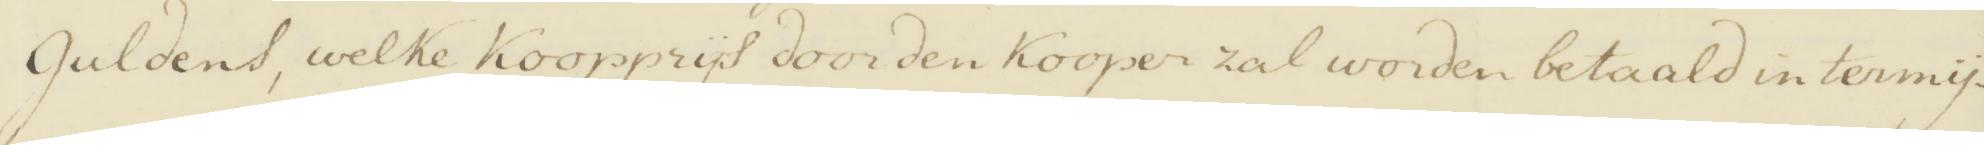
Guldens, welke koopprijs door den kooper zal worden betaald in termij-
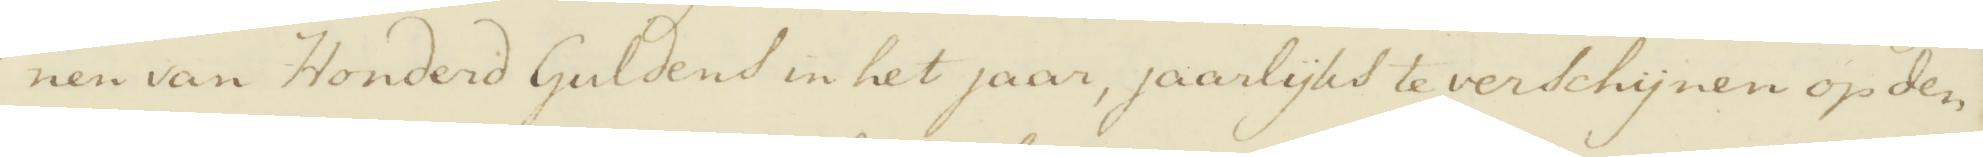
nen van Honderd Guldens in het jaar, jaarlijks te verschijnen op den
